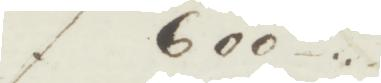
ƒ 600 -.
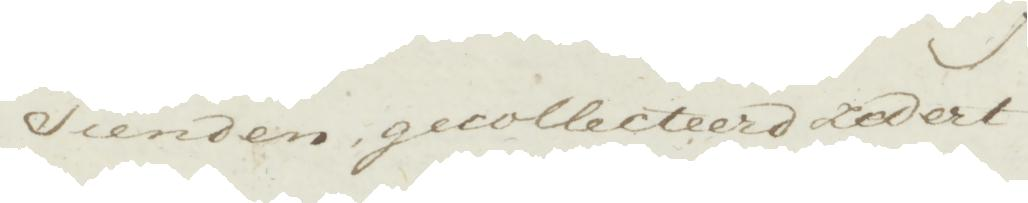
Tienden, gecollecteerd zedert
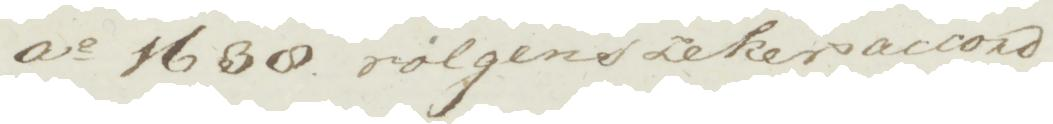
a=o 1638. volgens zeker accord
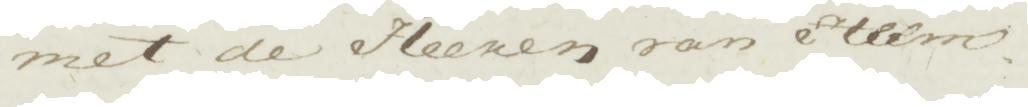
met de Heeren van Heem,
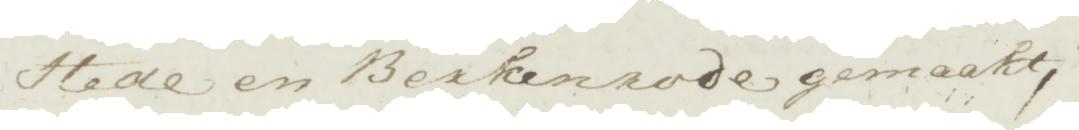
stede en Berkenrode gemaakt,
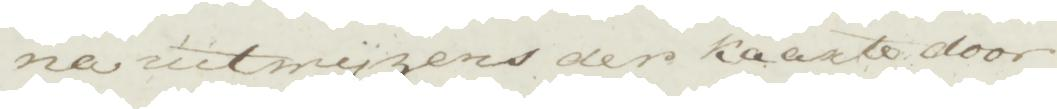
na uitwijzens der kaarte door
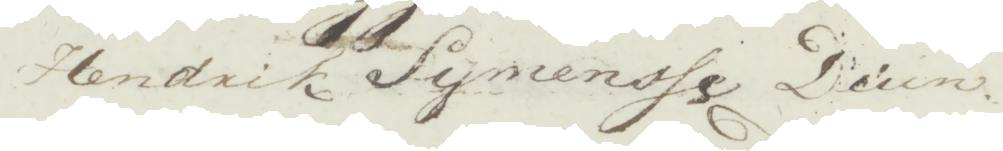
Hendrik Symensse Duin,
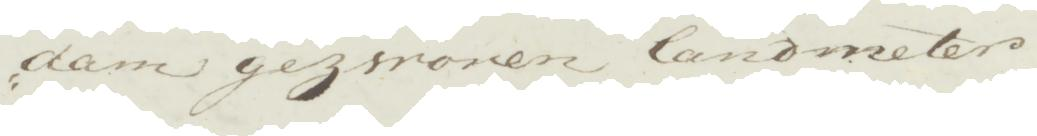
„dam gezworen landmeter
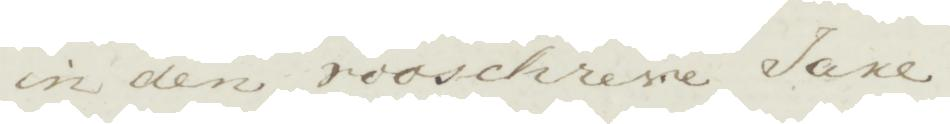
in den vooschreve Iare
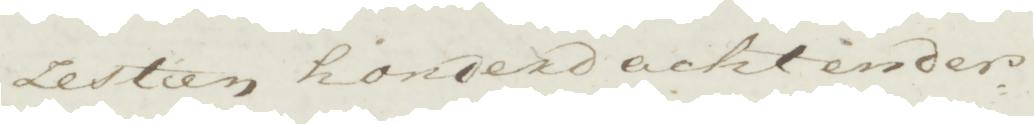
zestien honderd acht en der=
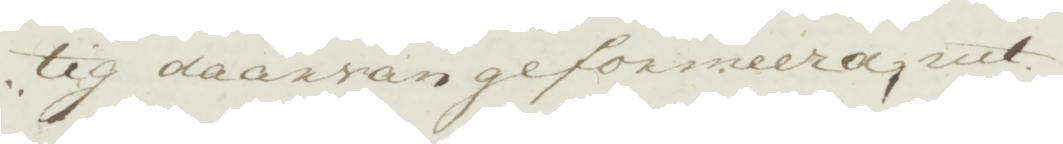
„tig daarvan geformeerd uit.
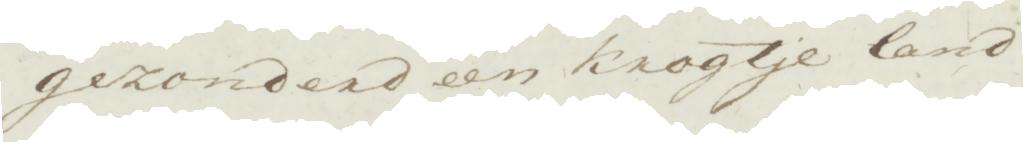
gezonderd éen krogtje land
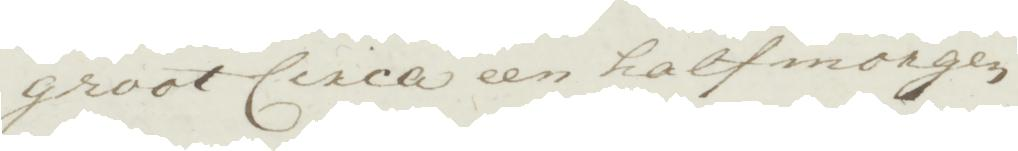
groot Circa een half morgen
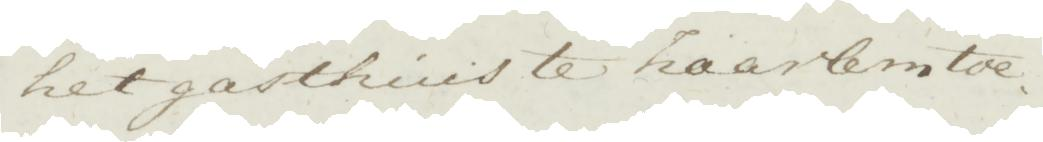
het gasthuis te haarlem toe„
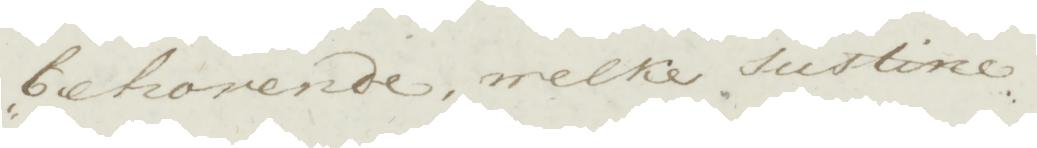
„behorende, welke sustine:
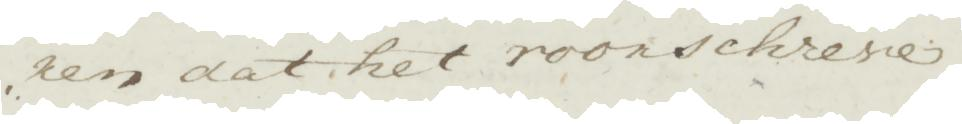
„ren dat het voorschreve
